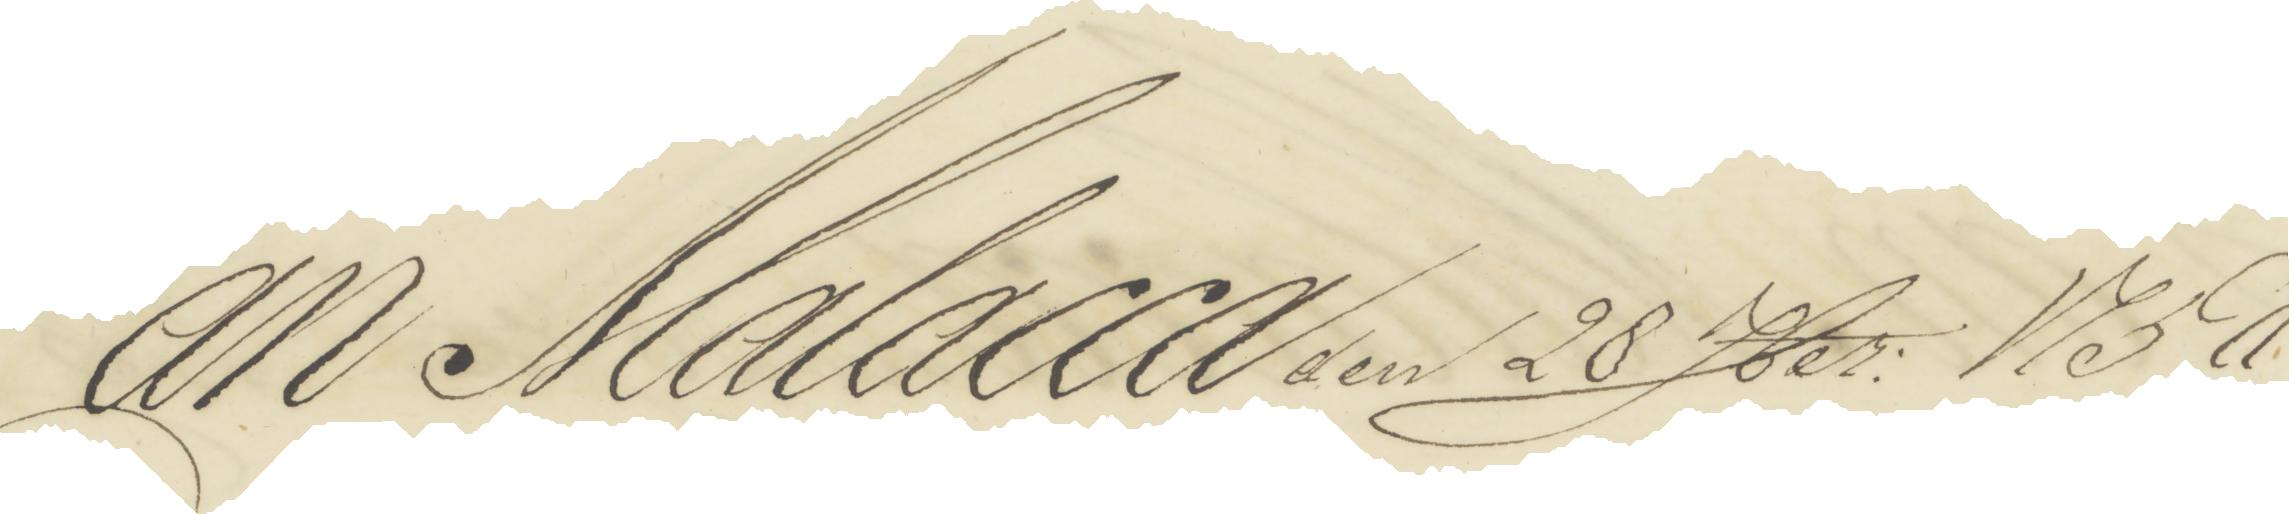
an Malacca den 28 7ber: 1754
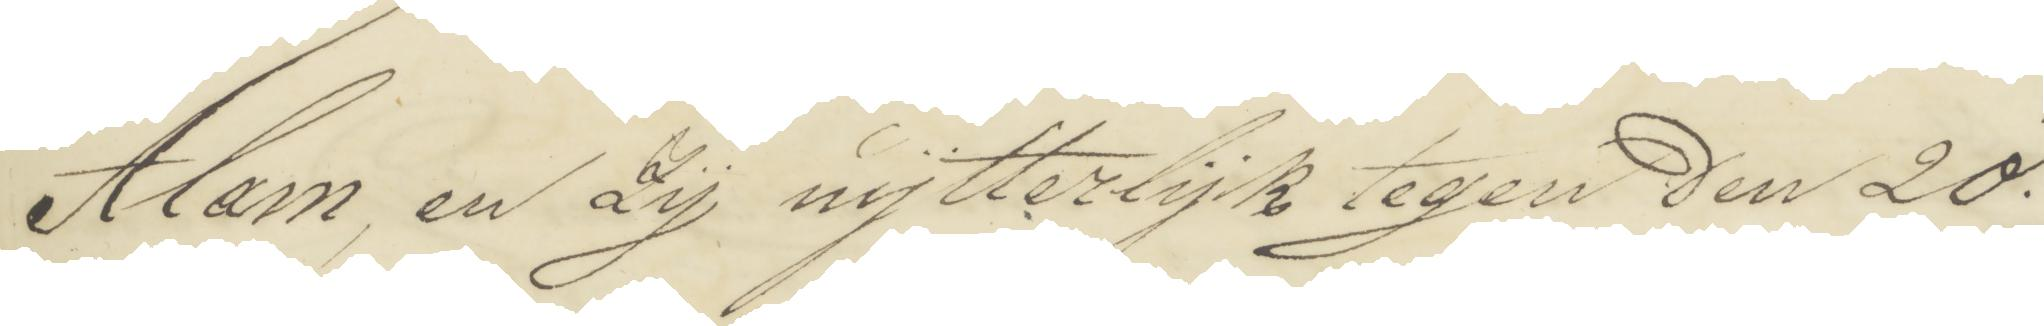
Alam, en zij uijtterlijk tegen den 20.
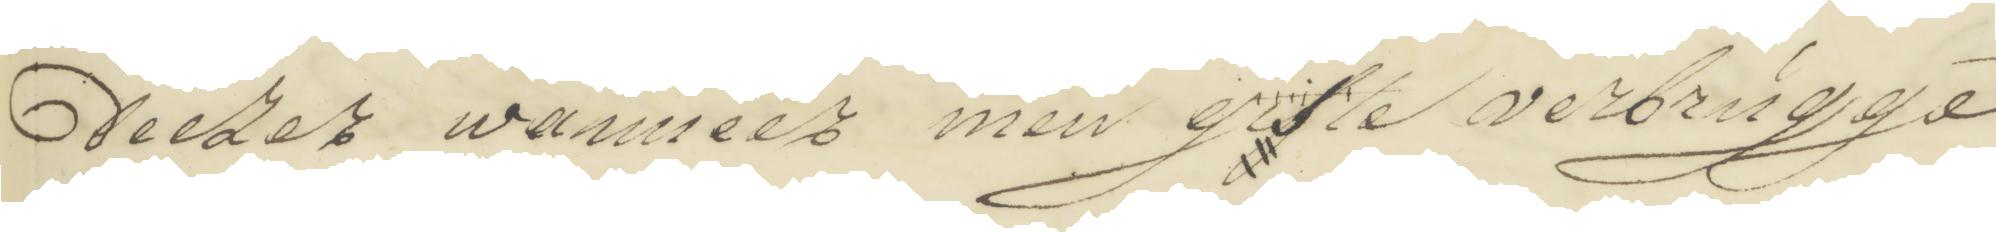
deezer wanneer men giste verbrugge
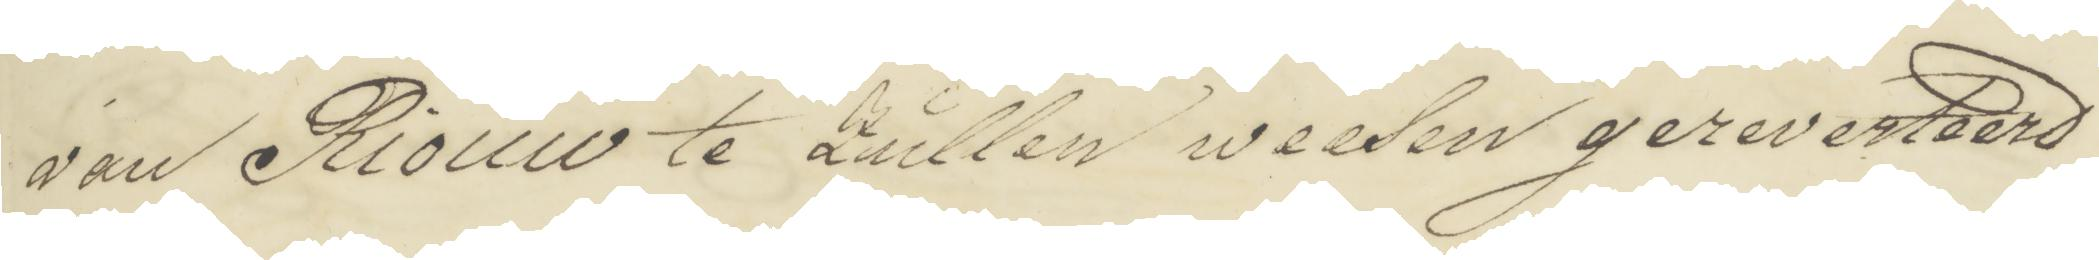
van Riouw te zullen weesen gereverteerd
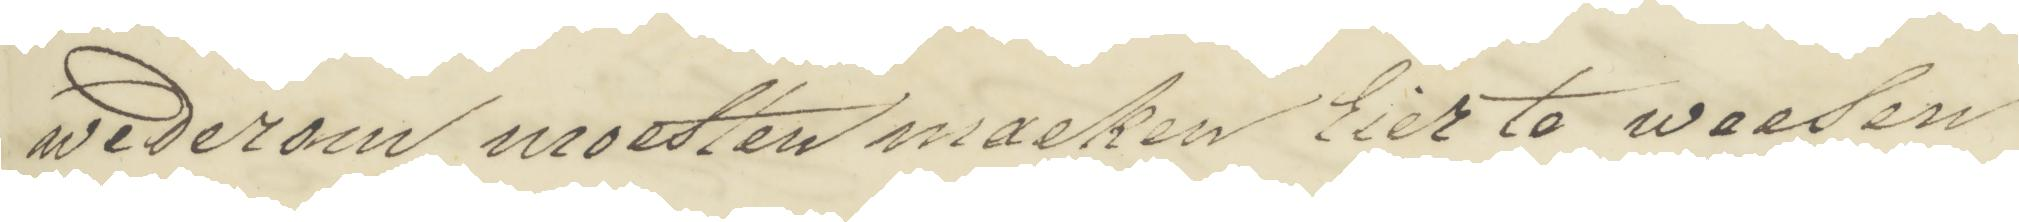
wederom moesten maeken hier te weesen
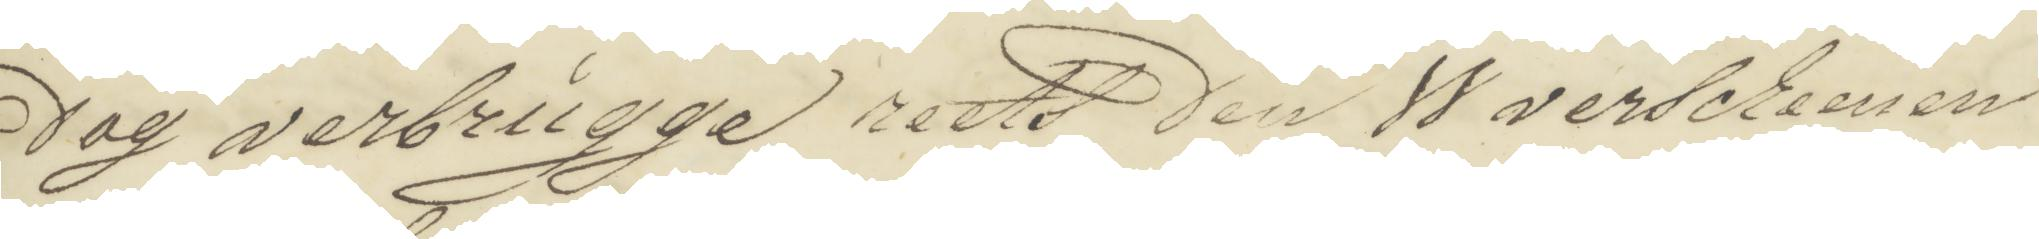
dog verbrugge reets den 18 verscheenen
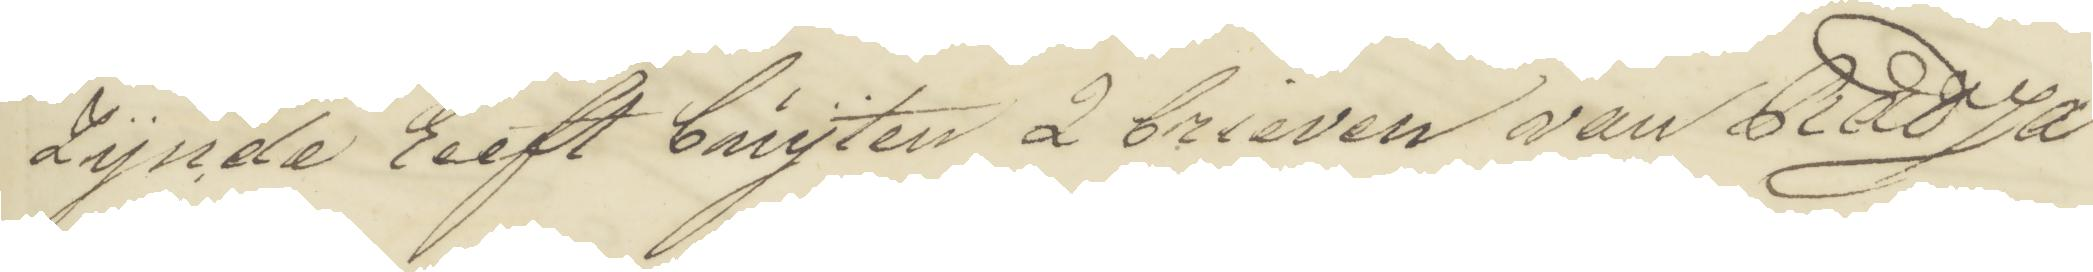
zijnde heeft buijten 2 brieven van bradja
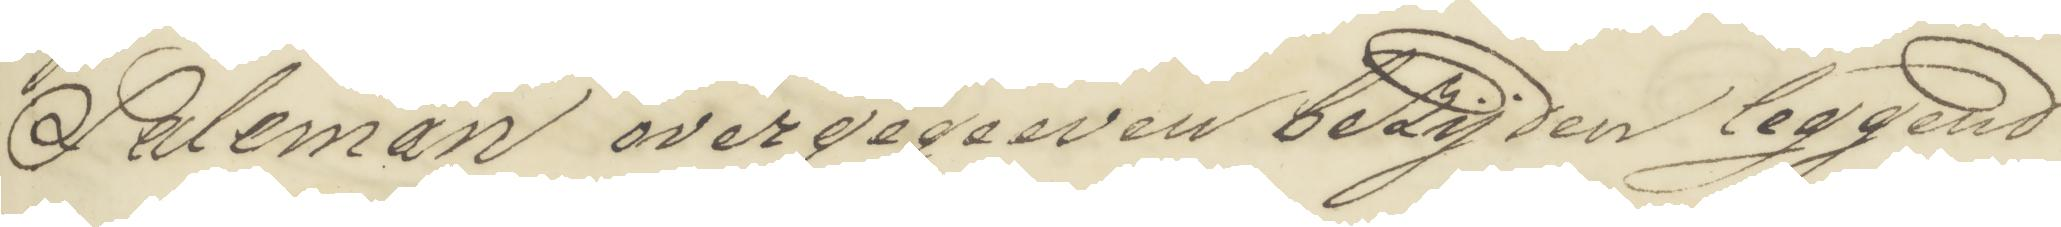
Saleman overgegeeven bezijden leggend
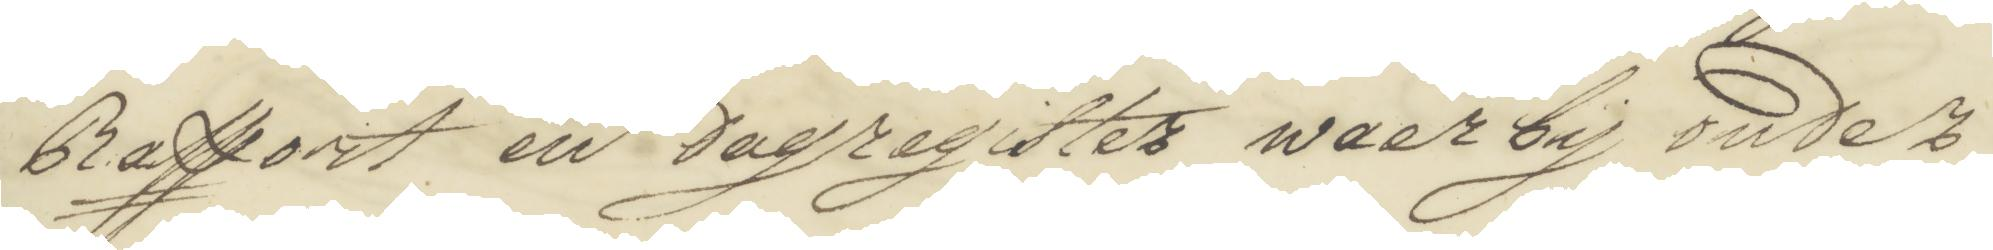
Rapport en dagregister waer bij onder
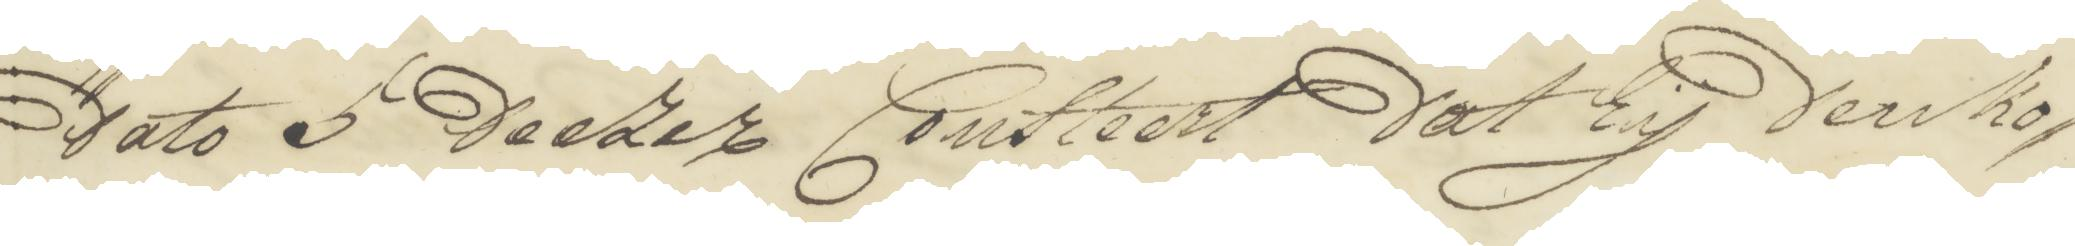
dato 5 deezer consteert dat hij den ko
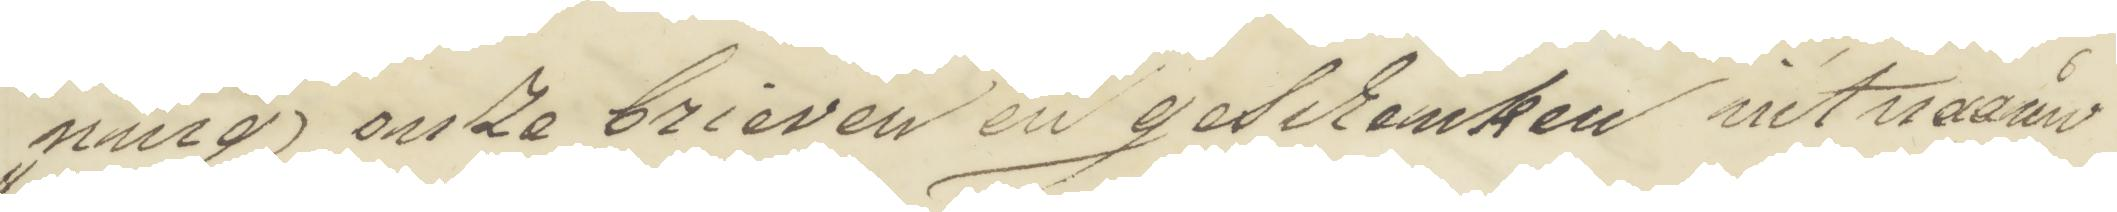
„ning onze brieven en geschenken in 't naauw
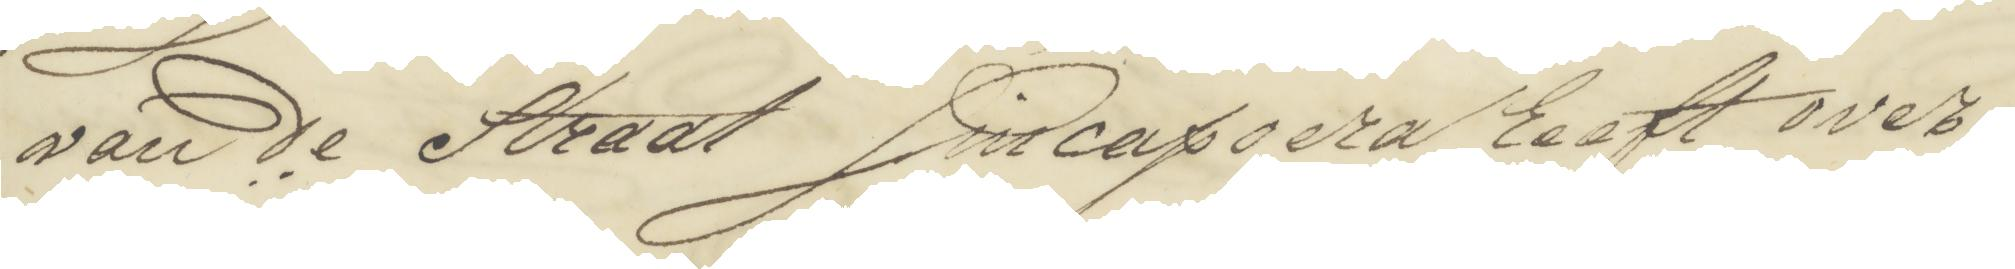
van de straat Sincapoera heeft over
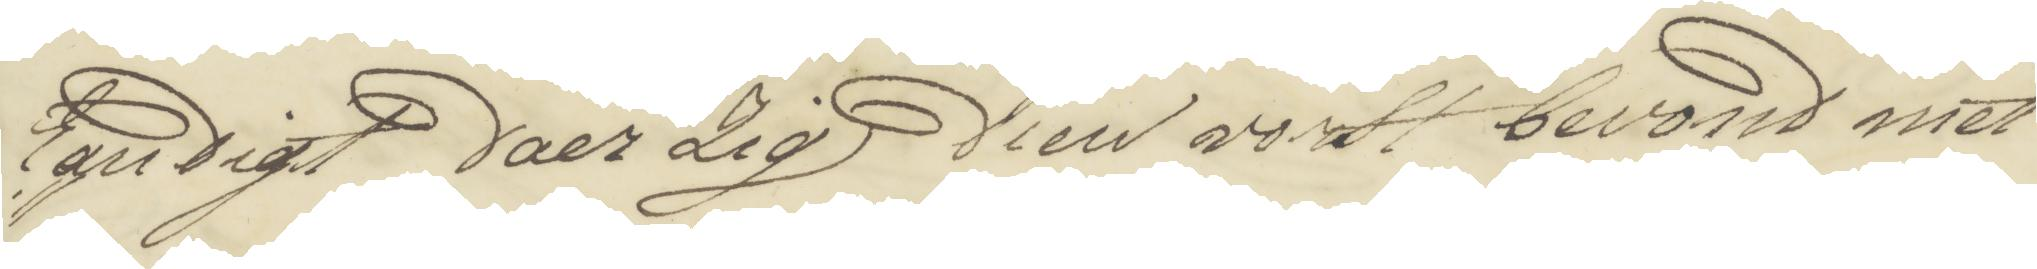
„handigt daer zig dien vorst bevond met
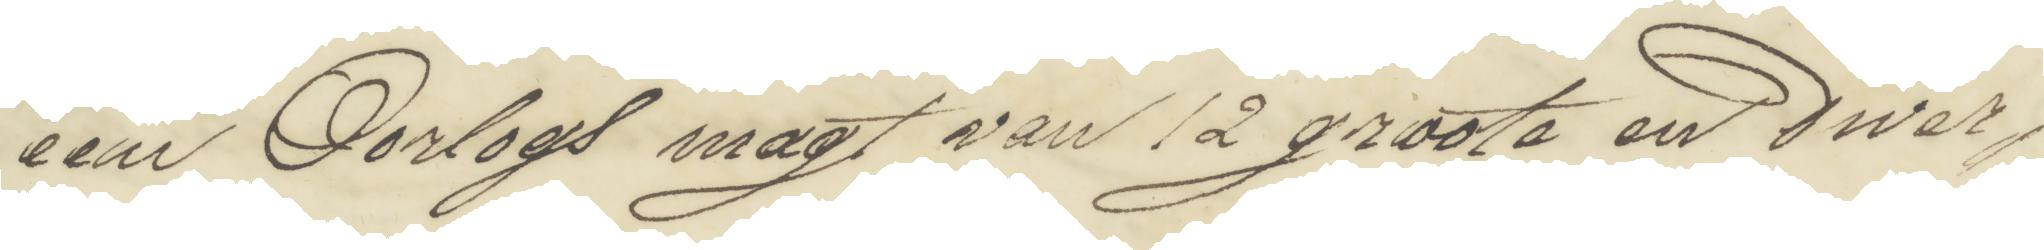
een Oorlogs magt van 12 groote en diver„
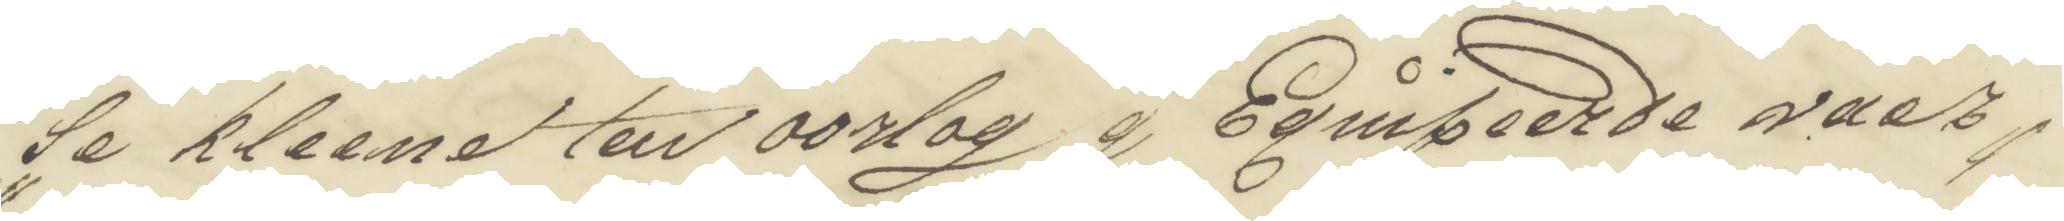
se kleene ten oorlog g Equipeerde vaer„
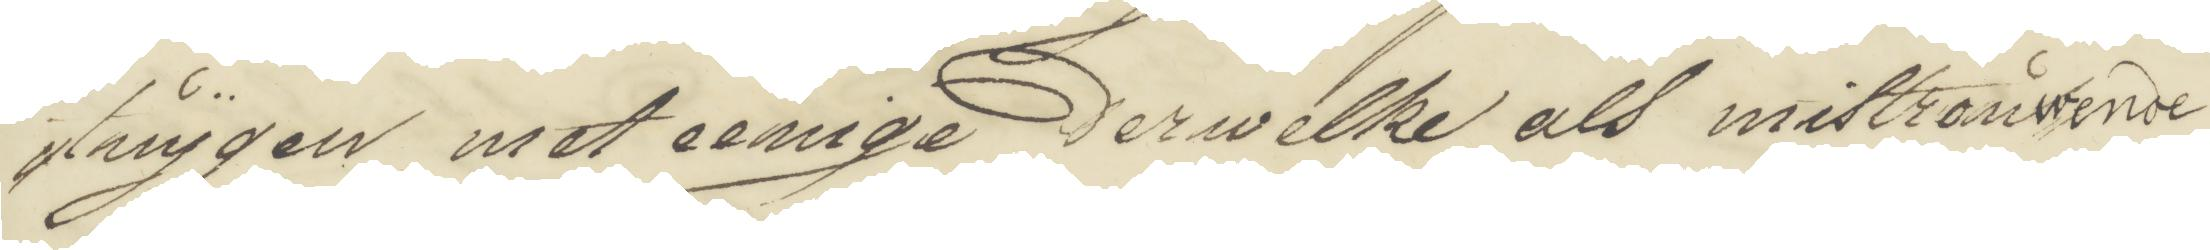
tuijgen met eenige derwelke als mistrouwende
